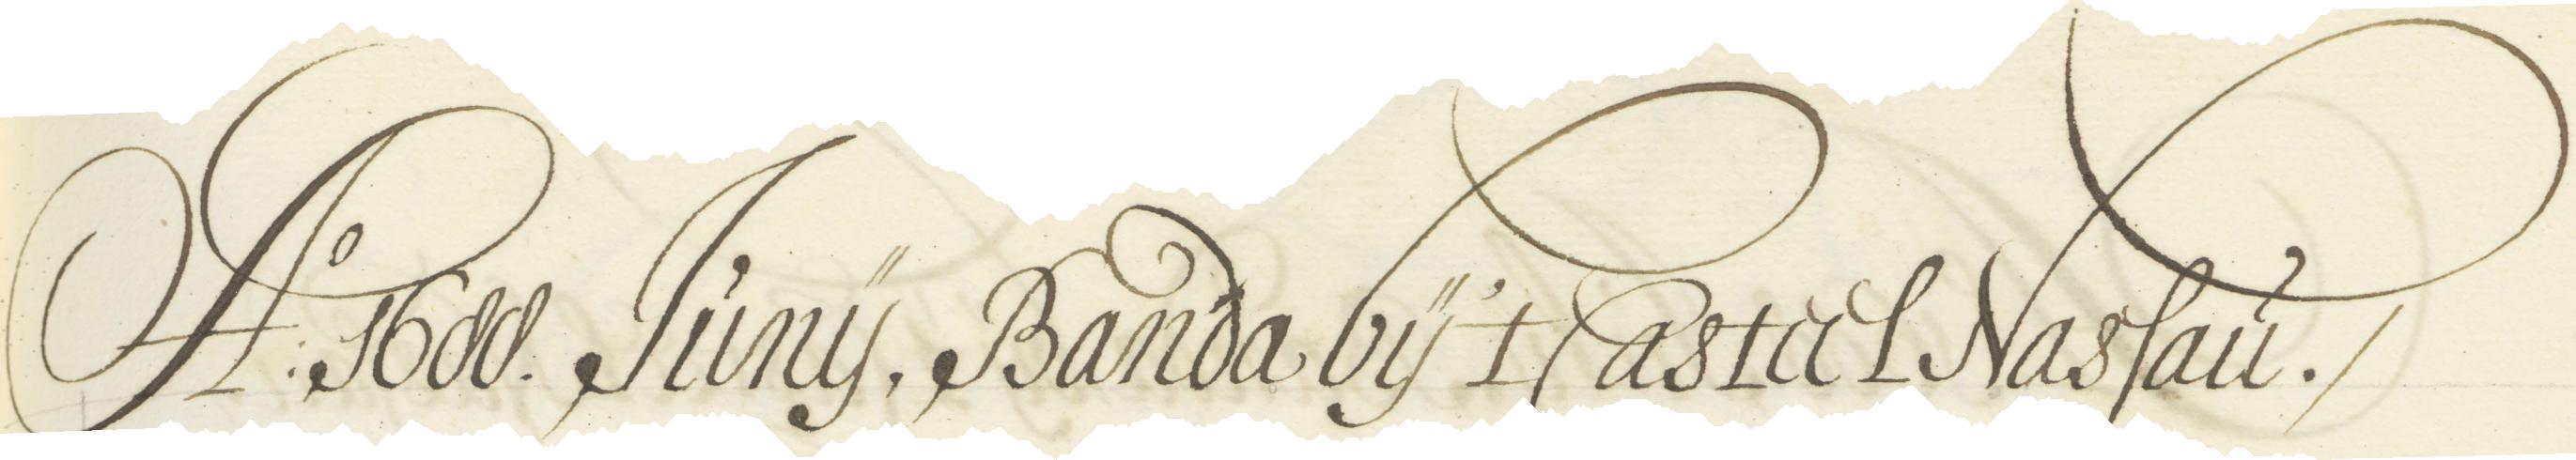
A:o 1688. Iunij, Banda bij 't Casteel Nassau./
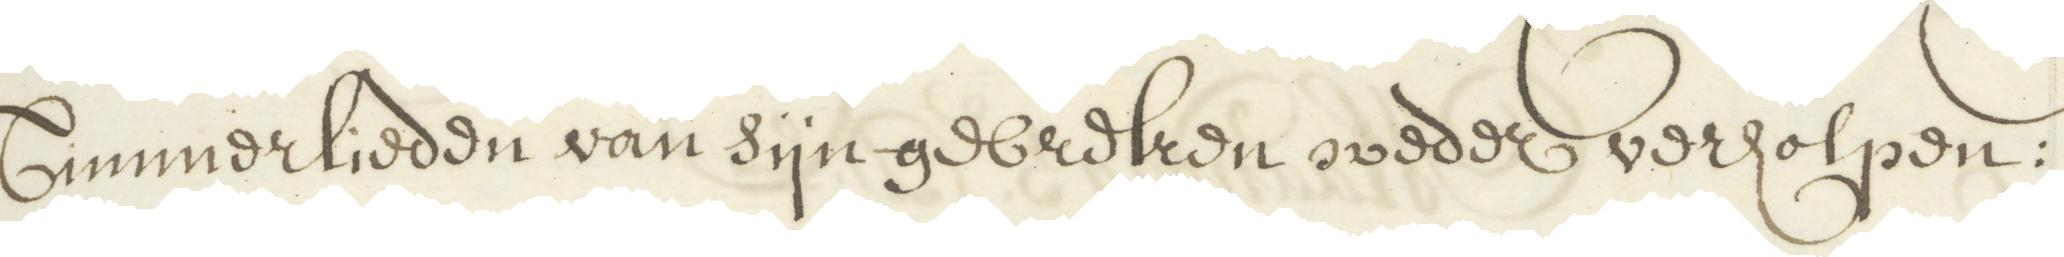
Timmerlieden van sijn gebreken weder verholpen:
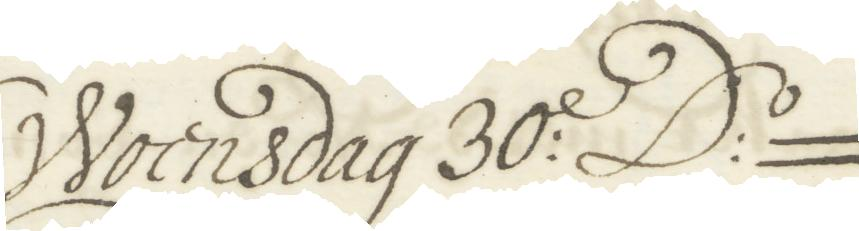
Woensdag 30:e D:=o
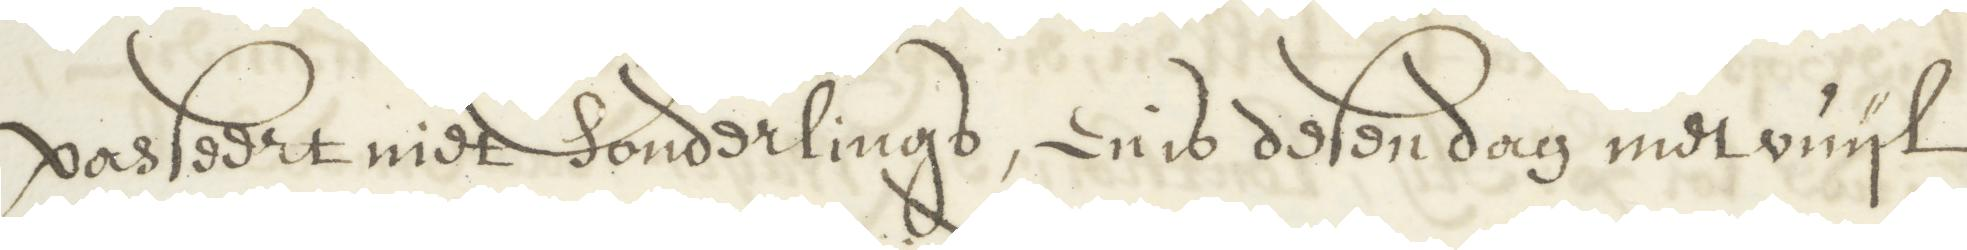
passeert niet sonderlings, en is desen dag met vuijl
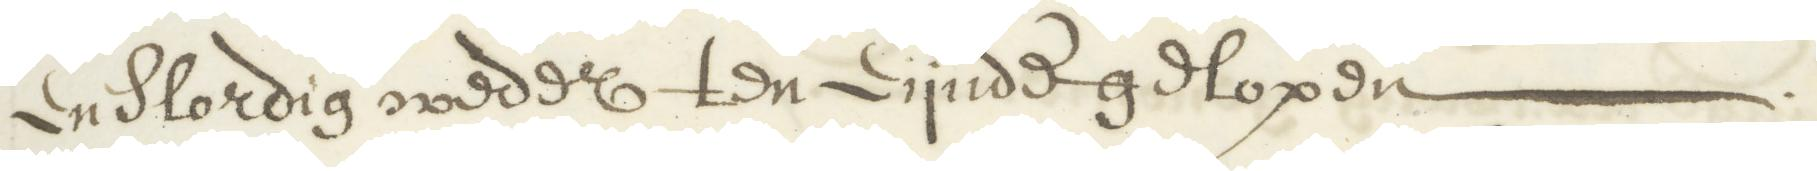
en slordig weder ten eijnde gelopen.
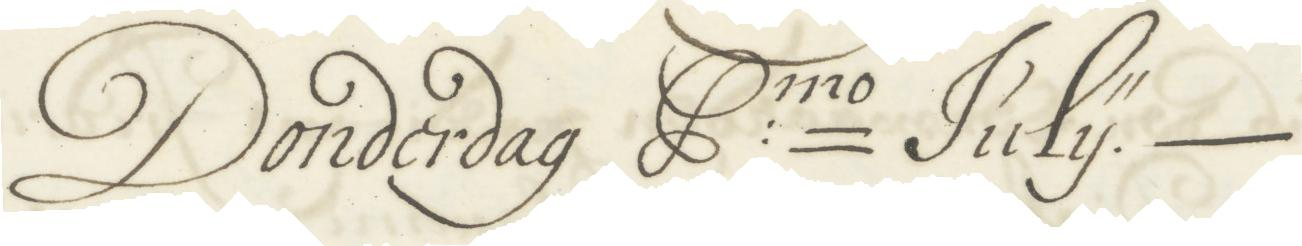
Donderdag P:=mo Iulij. —
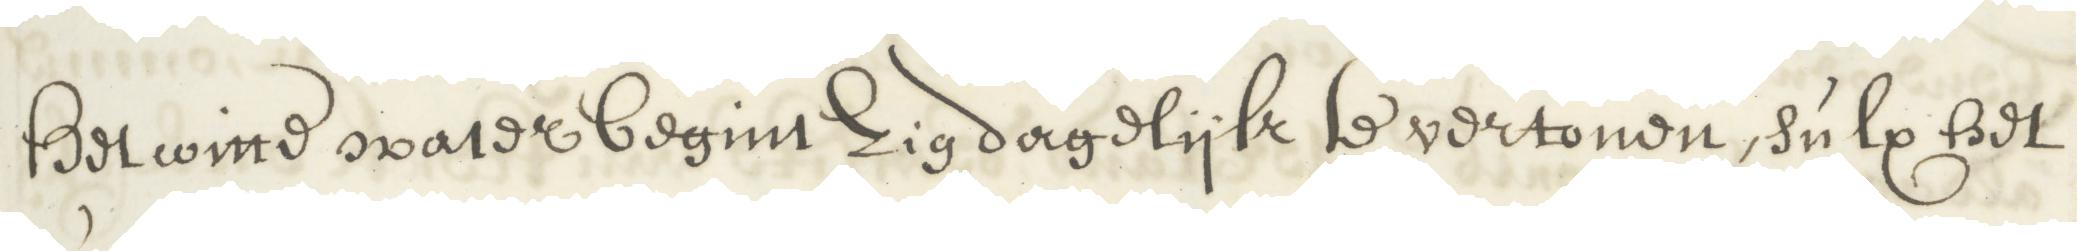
het witte water begint zig dagelijk te vertonen, sulx het
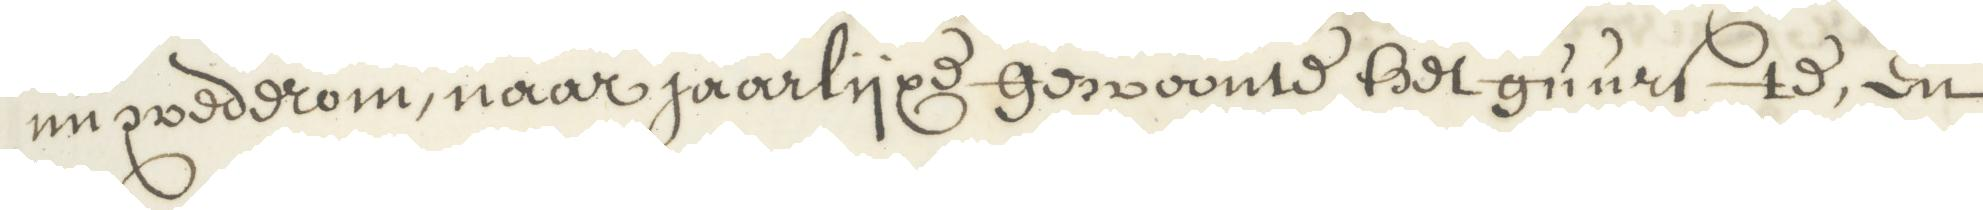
nu wederom, naar jaarlijxe gewoonte het guurste, en
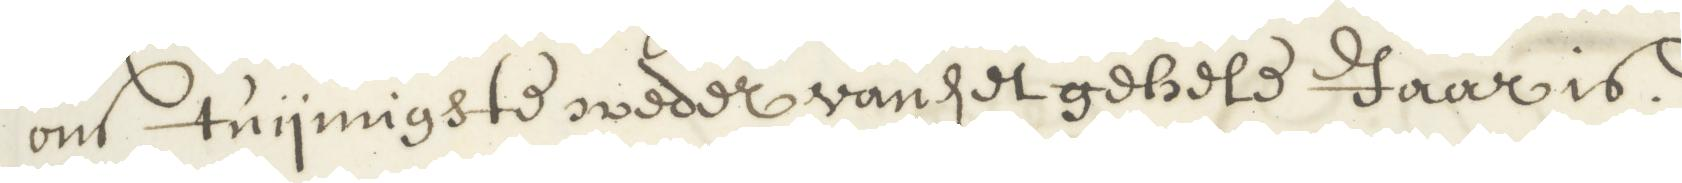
onstuijmigste weder van het gehele Iaar is.
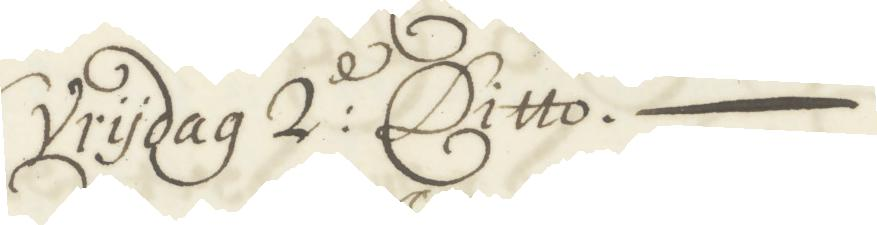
Vrijdag 2:e Ditto. —
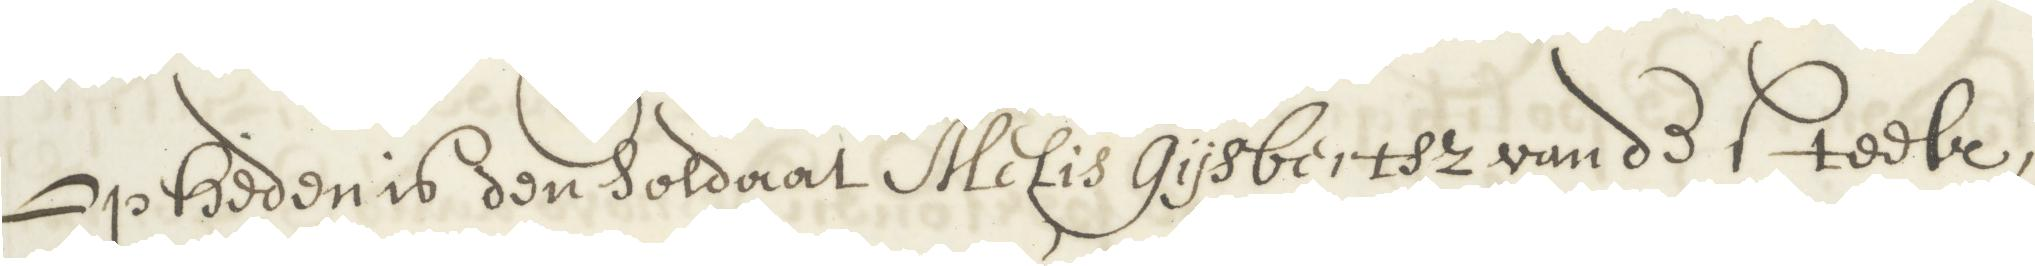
Op heden is den soldaat Melis gijsbertsz van de steek,
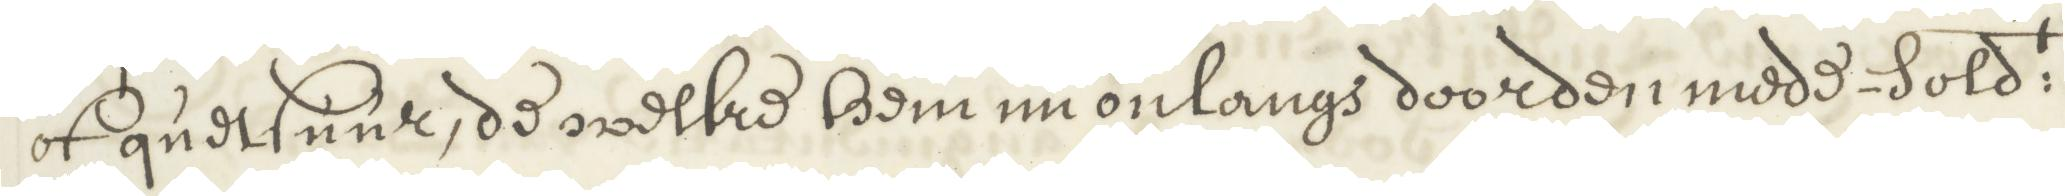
of quetsuur, de welke hem nu onlangs doorden mede-sold:t
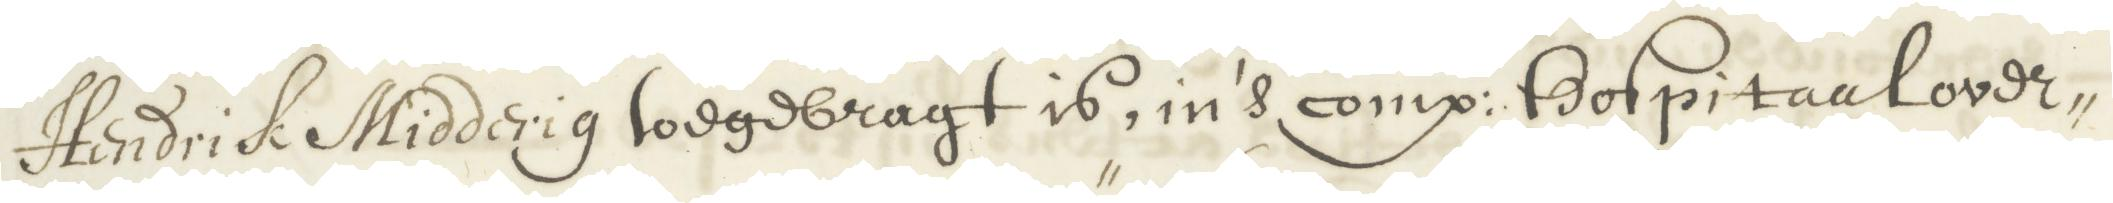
Hendrik Midderig toegebragt is, in ’s comp:s Hospitaal over„
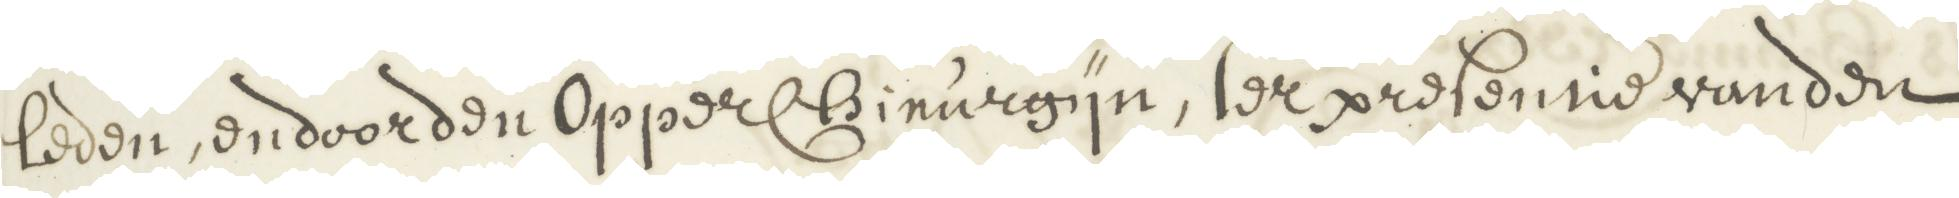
leden, en door den Opperchirurgijn, ter presentie van den
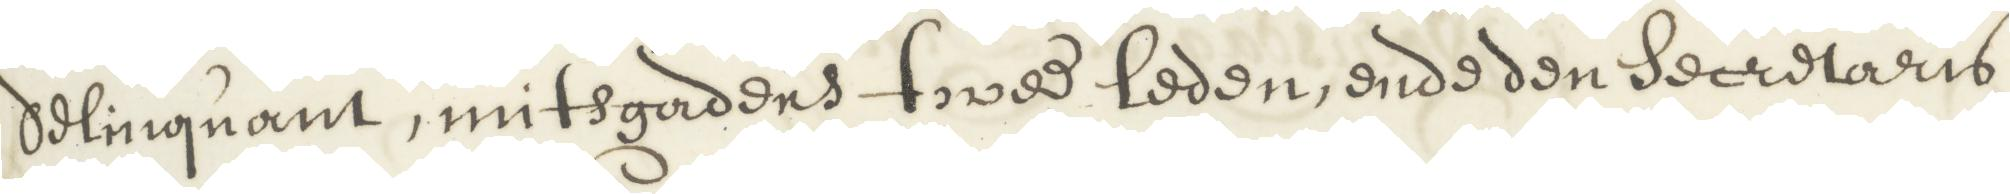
delinquant, mitsgaders twee leden, ende den secretaris
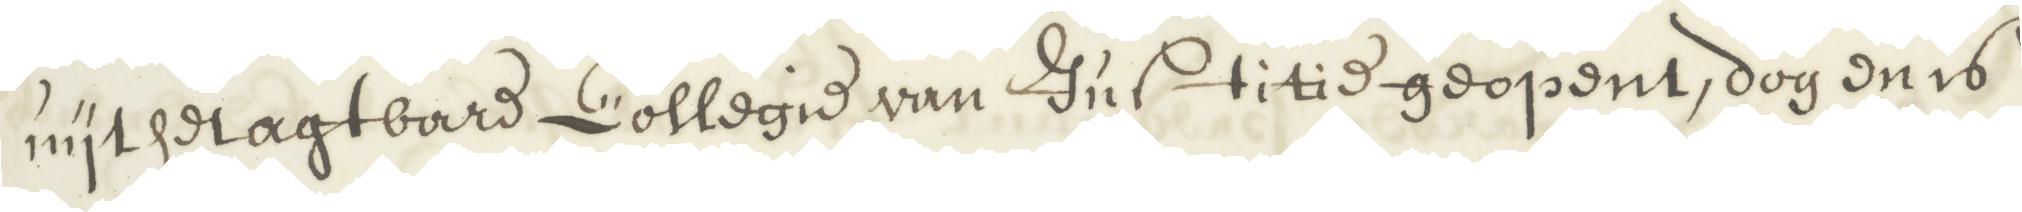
uijt het agtbare Collegie van Iustitie geopent, dog en is
